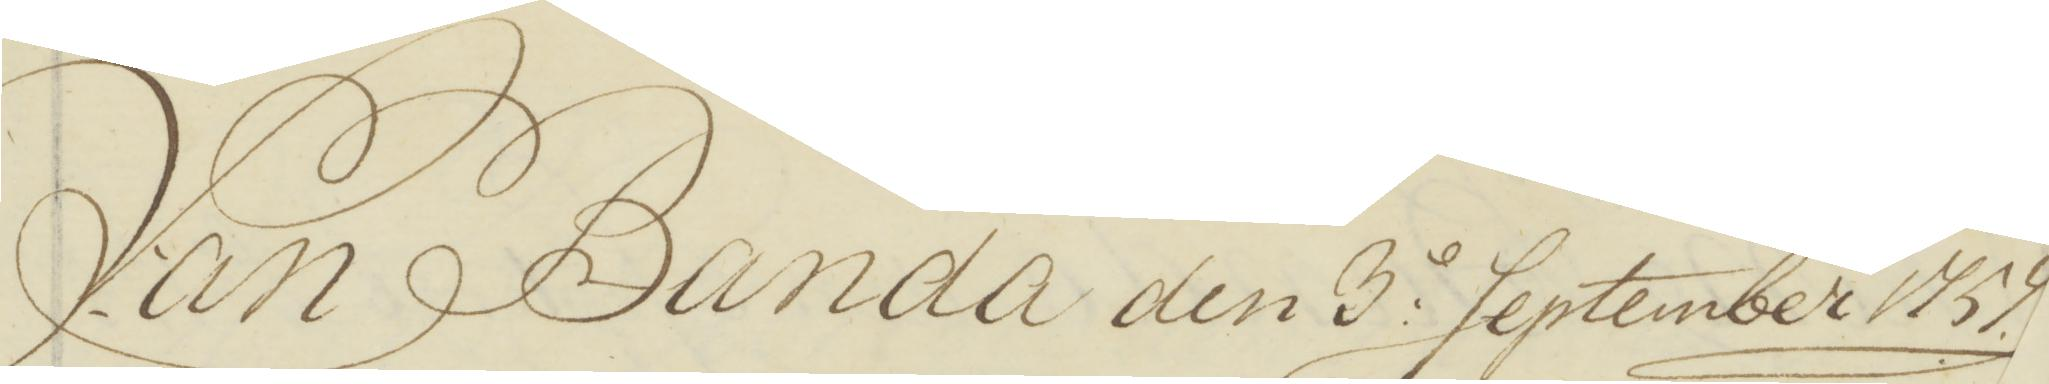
Van Banda den 3:e September 1757.
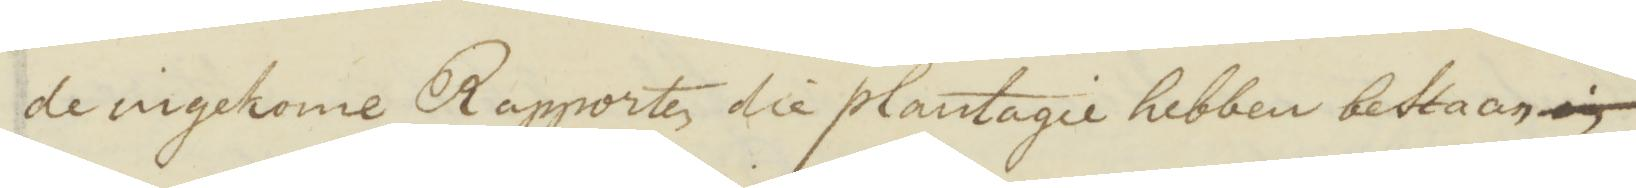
de ingekome Rapporten die plantagie hebben bestaan in
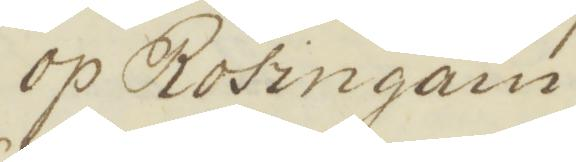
op Rosingain
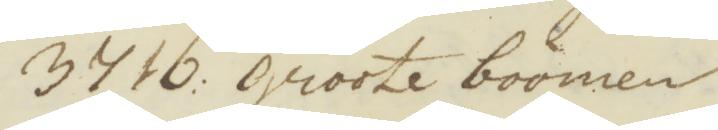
3716: groote boomen
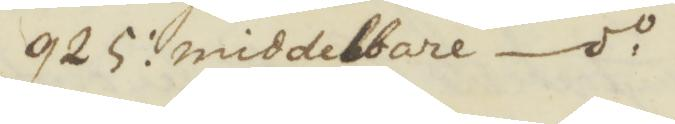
925: middelbare _d:o
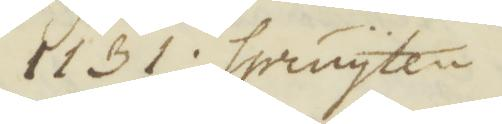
1131: spruijten
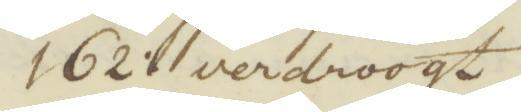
162: verdroogt
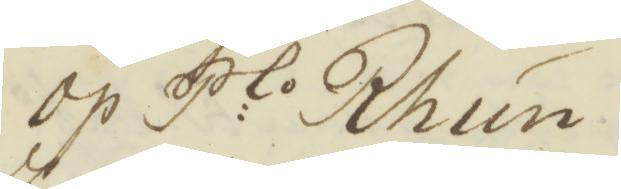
op P:lo Rhun
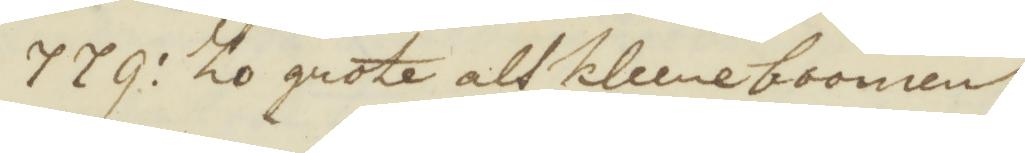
779: zo grote als kleene boomen
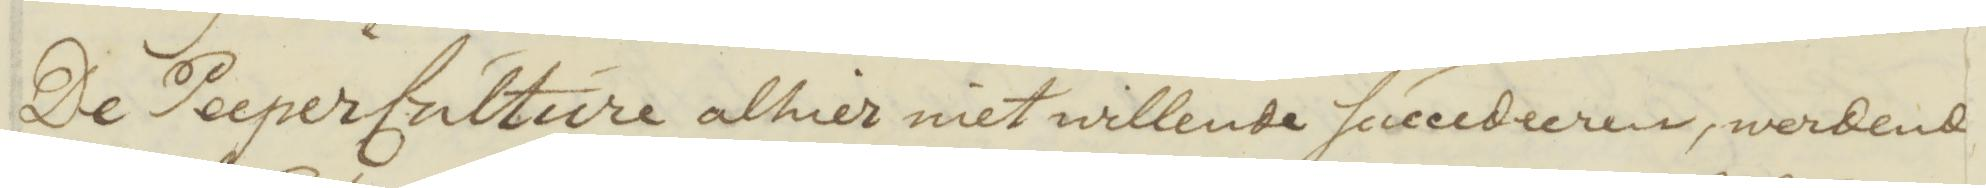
De Peeper Culture alhier niet willende succedeeren, werdend
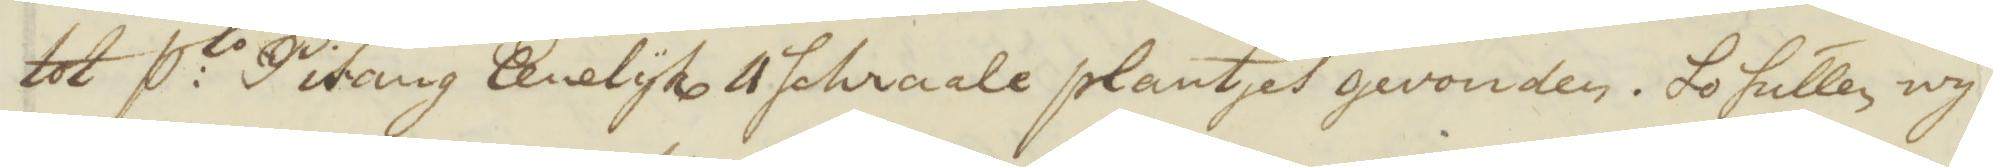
tot p:lo Pitang Eenelijk 4 schraale plantjes gevonden. so zullen wy
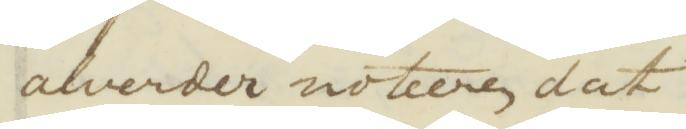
alverder noteeren dat
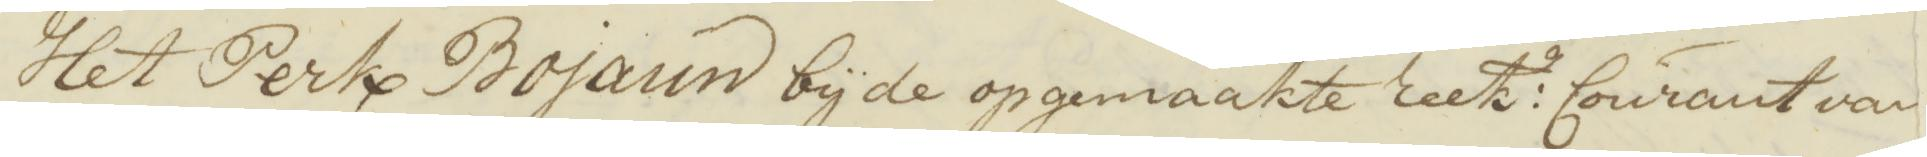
Het Perk Bojauw bij de opgemaakte reek:g Courant van
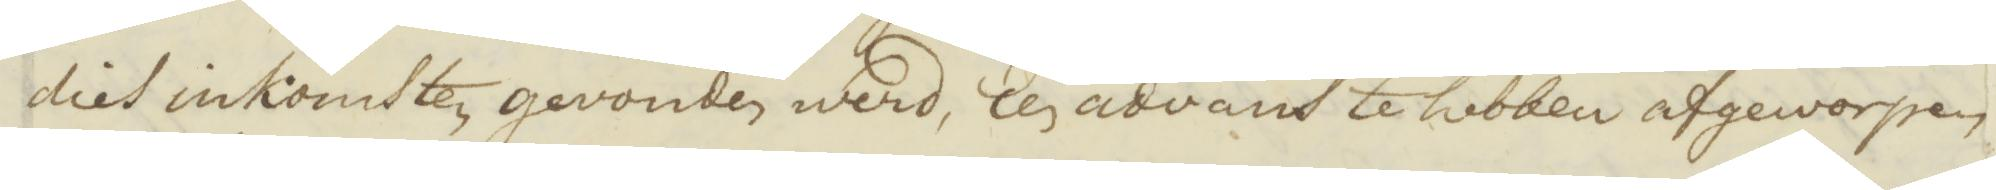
dies inkomsten gevonden werd, Een advans te hebben afgeworpen
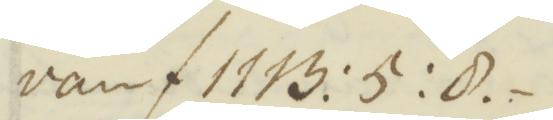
van ƒ 1113:5:8.-
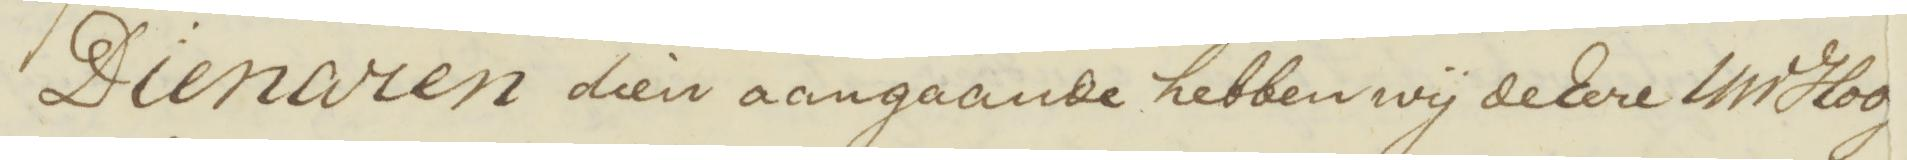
Dienaren dien aangaande hebben wij de Eere Uw Hoo
